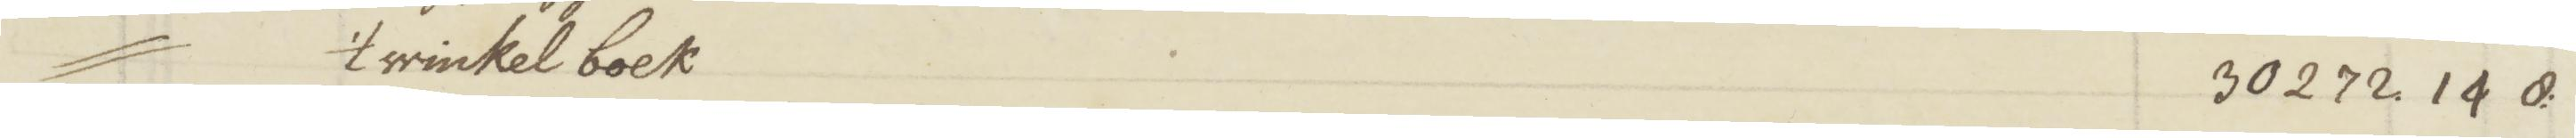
// 't winkel boek 30272:14 8:
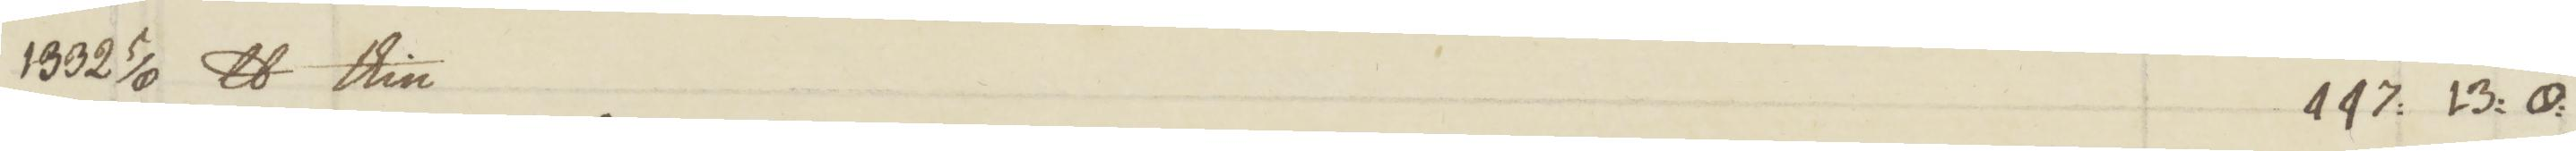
1332 5/8 lb thin 447: 13: 8:
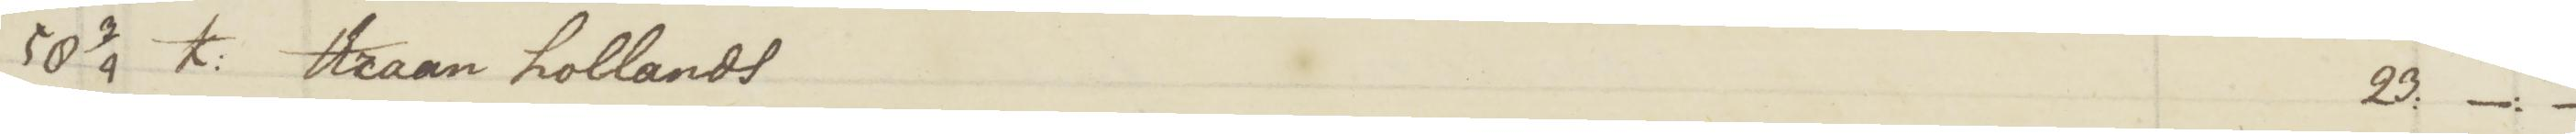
58 ¾ k: thraan hollands 23: —: —:
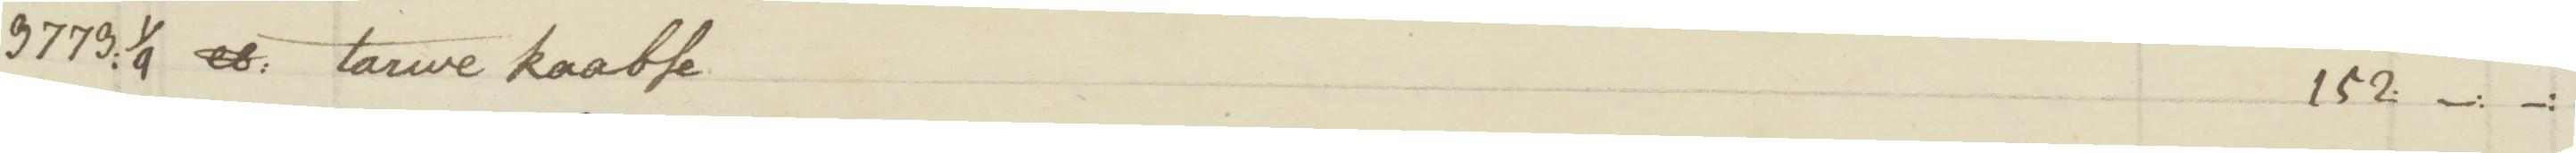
3773: 1/4 lb: tarwe kaabse 152: —: —:
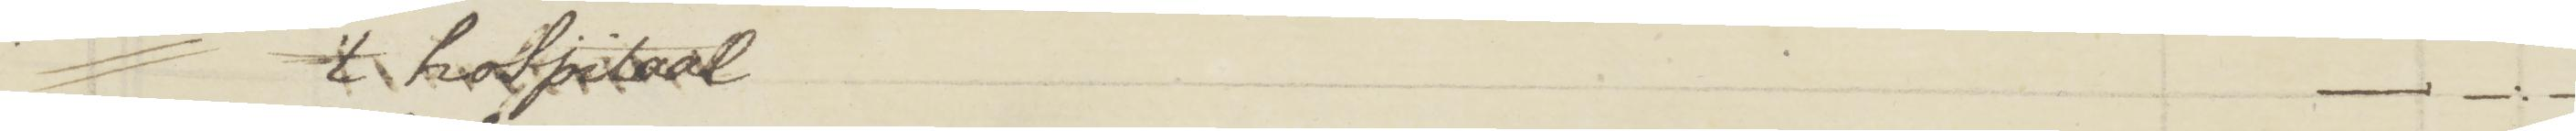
// ’t hospitaal —: —: —:
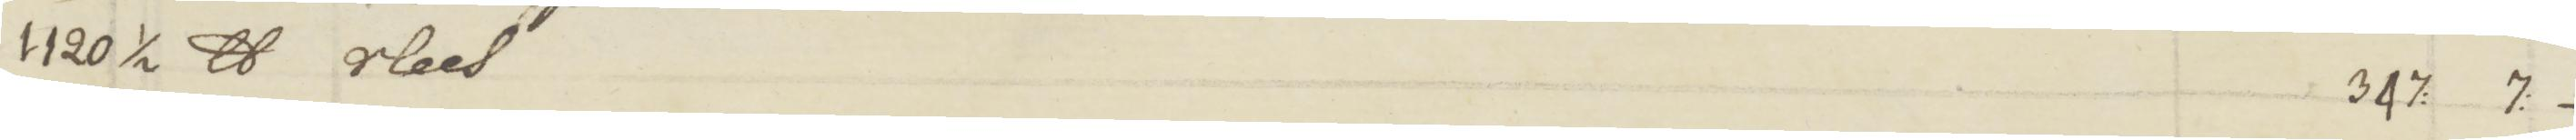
1120 ½ lb vlees 347: 7: —
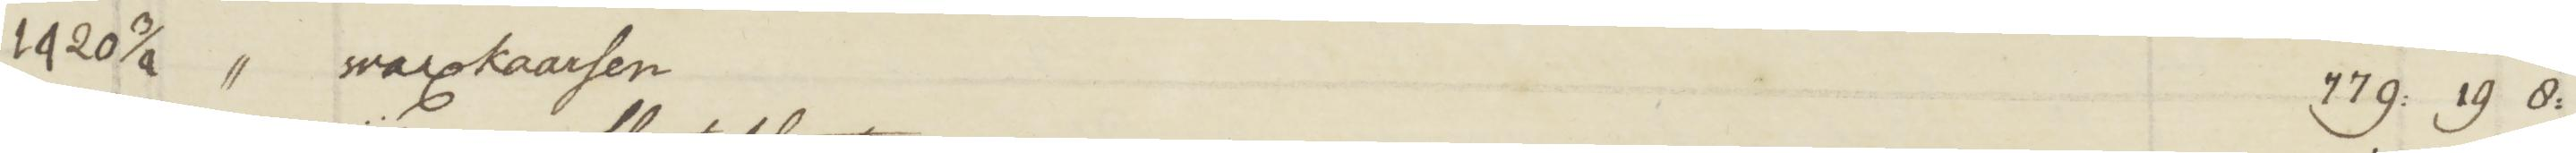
1420 ¾ „ waxkaarsen 779: 19 8:
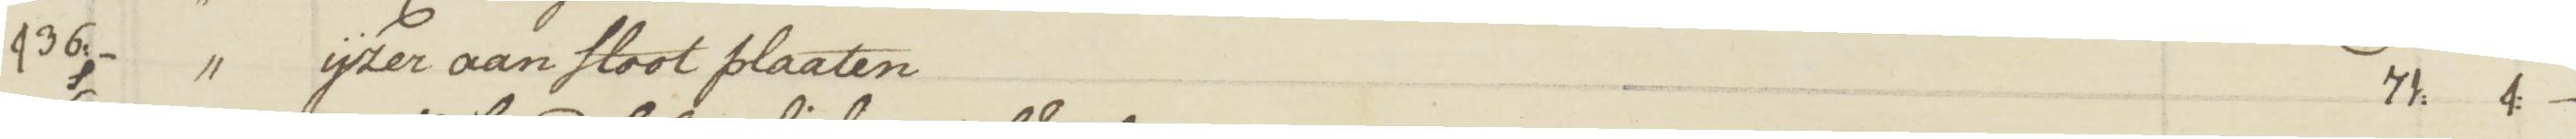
436: — „ ijzer aan sloot plaaten 71: 4: —
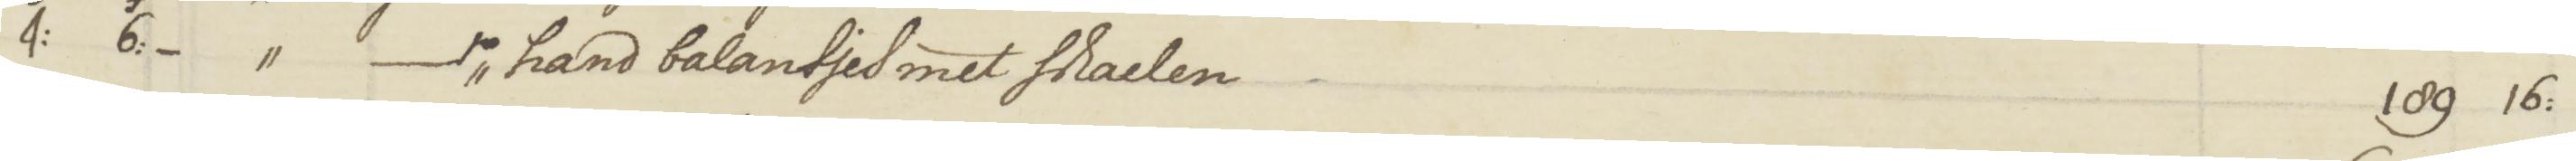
4: 6: — „ —:o hand balansjes met schaelen 189 16:
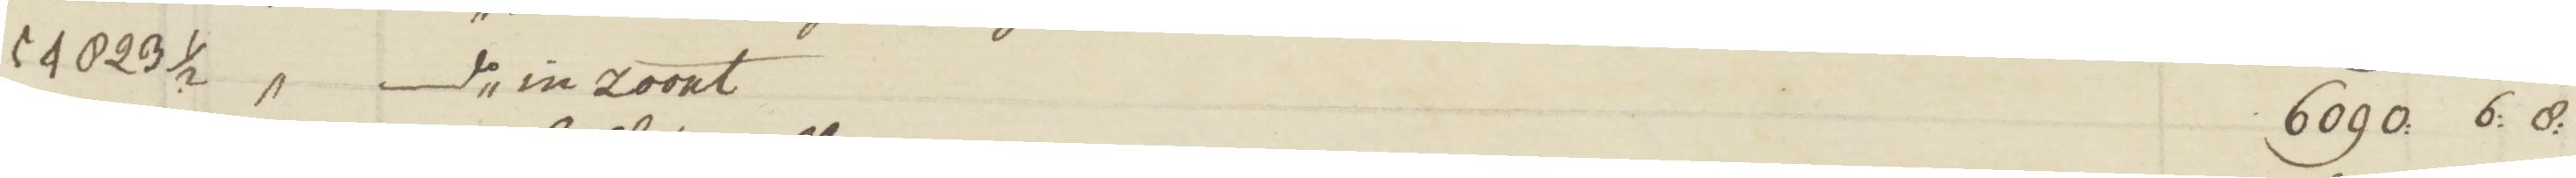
54823 ½ „ —:o in zoort 6090: 6: 8:
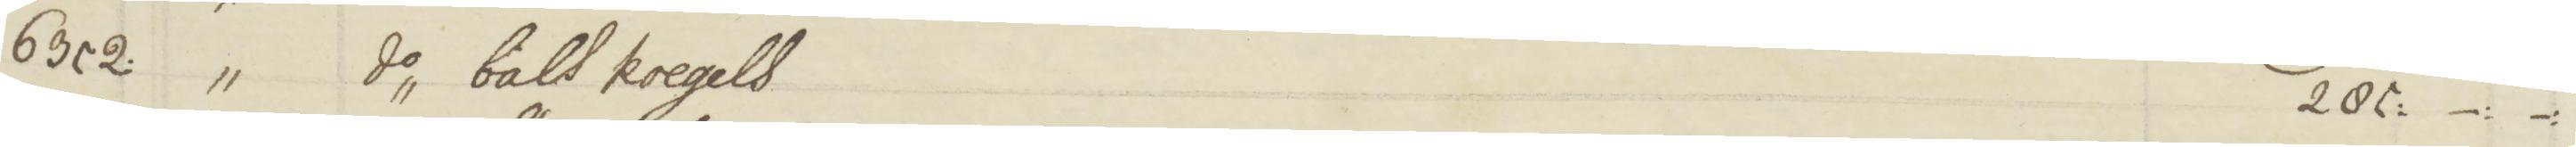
6352: „ d:o bals koegels 285: —: —:
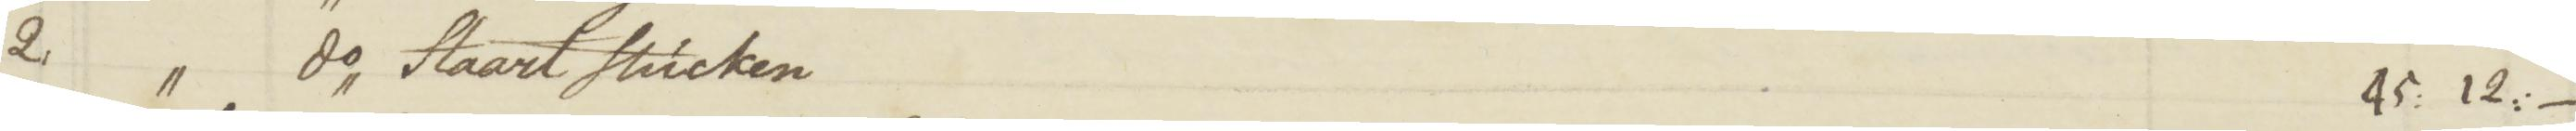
2: „ d:o staart stucken 45: 12: —
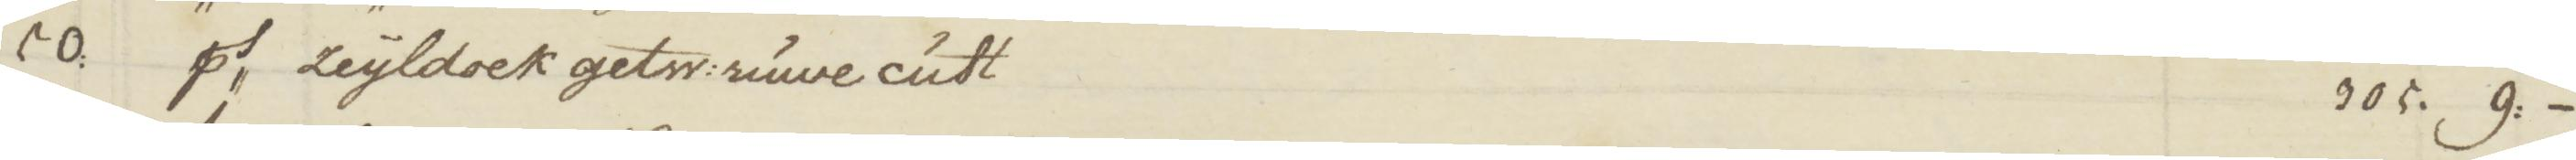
50: p„s zeijldoek getw: ruwe cust 305. 9: —
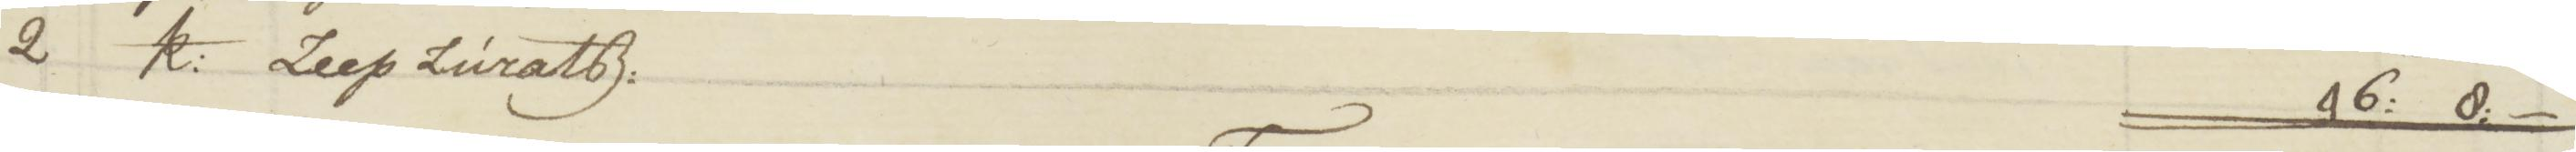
2 k: Zeep Zuratsz: 46: 8: —
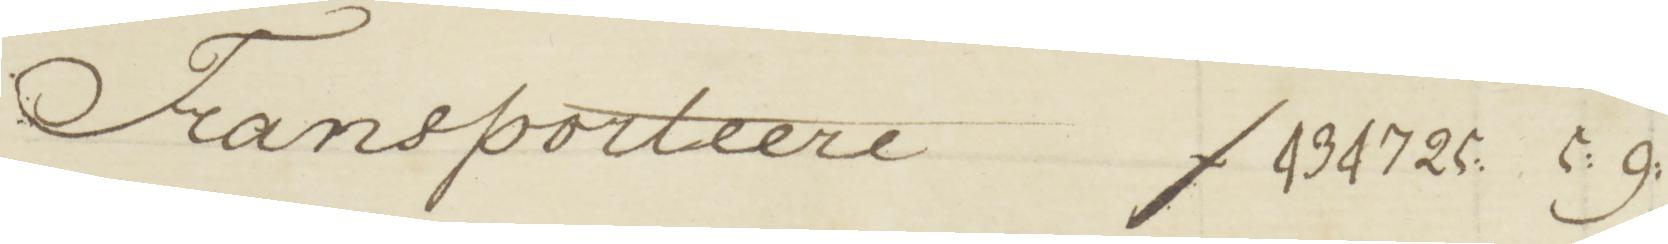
Transporteere ƒ 434725: 5: 9:
